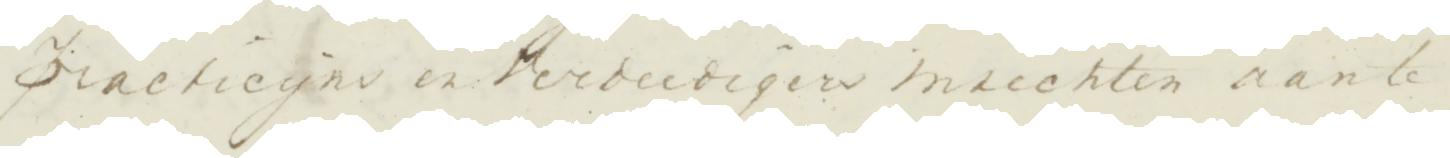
Practicijns en Verdeedigers in rechten aan te
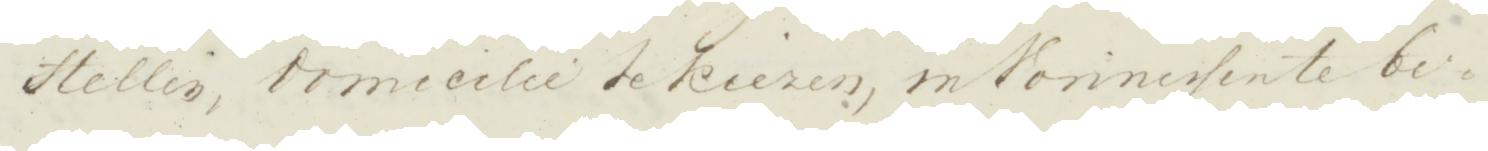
stellen, domicilie te kiezen, in Vonnissen te be„
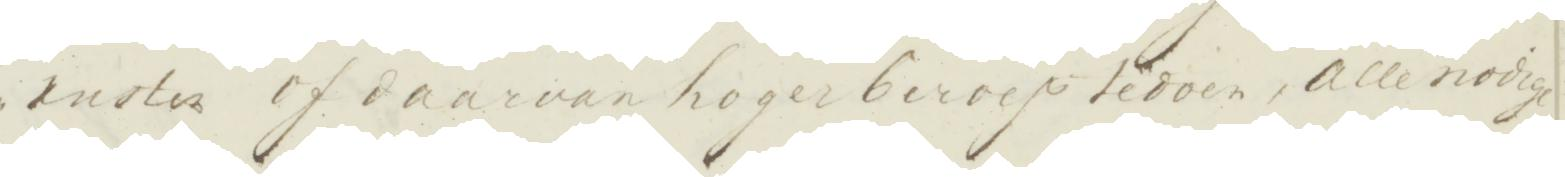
rusten of daarvan hoger beroep te doen, alle nodige
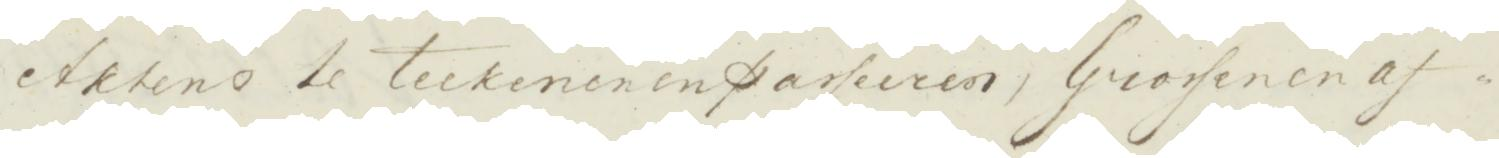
Aktens te teekenen en passeeren, Grossen en af„
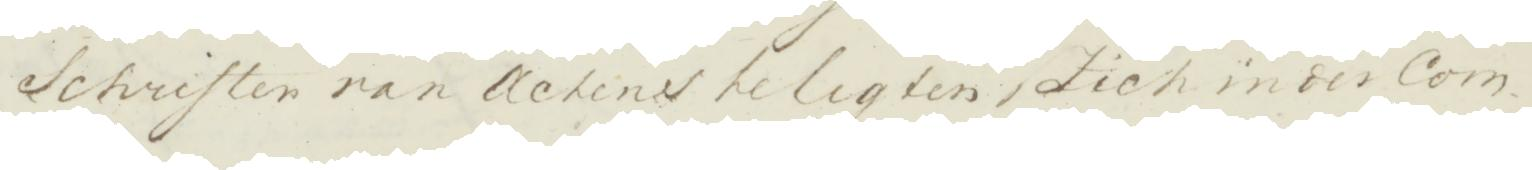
schriften van Actens te ligten, zich in der Com„
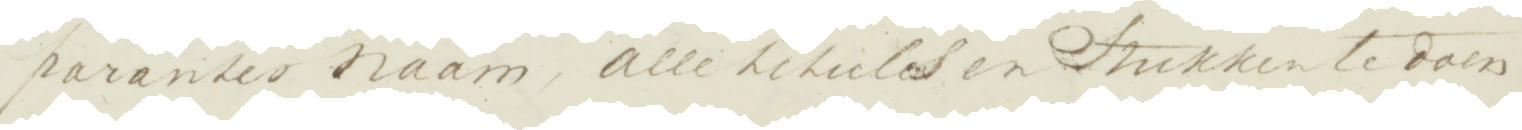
parantes naam, alle titules en Stukken te doen
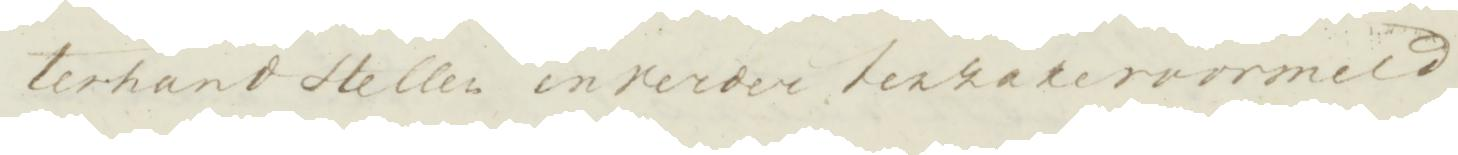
terhand stellen en verder terzake voormeld
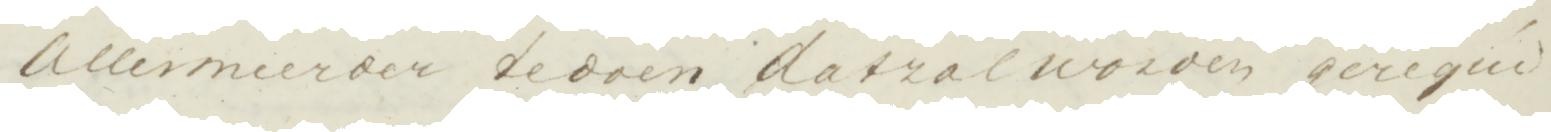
Alles meerder te doen dat zal worden gerequi
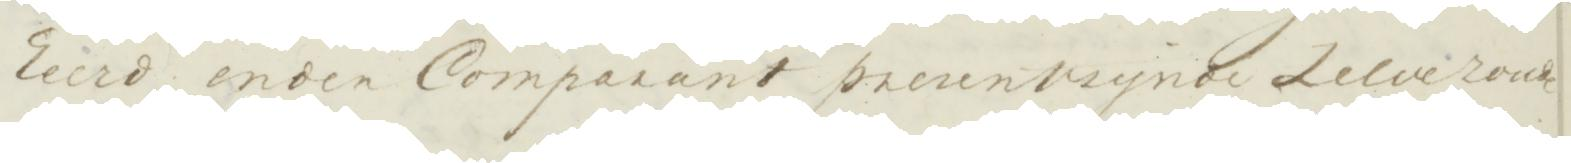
reerd, en den Comparant present zijnde zelve zoude
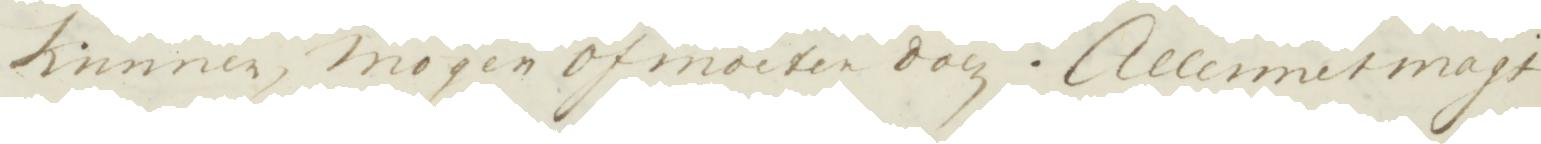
kunnen, mogen of moeten doen; Alle met magt
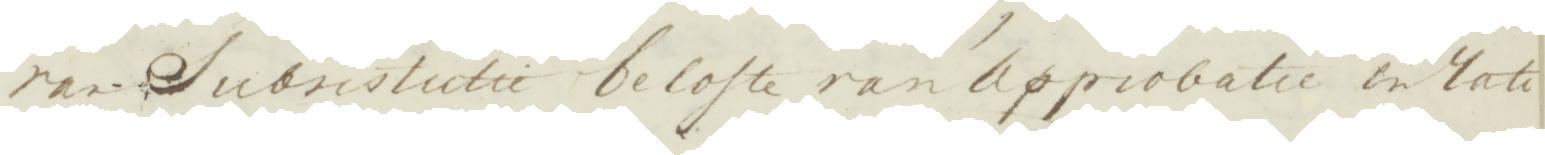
van Subsistutie belofte van Approbatie en Rati
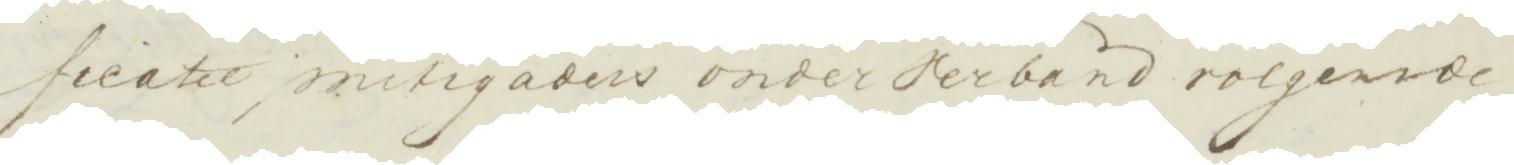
ficatie mitsgaders onder Verband volgens de
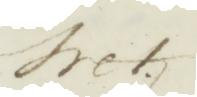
Wet.
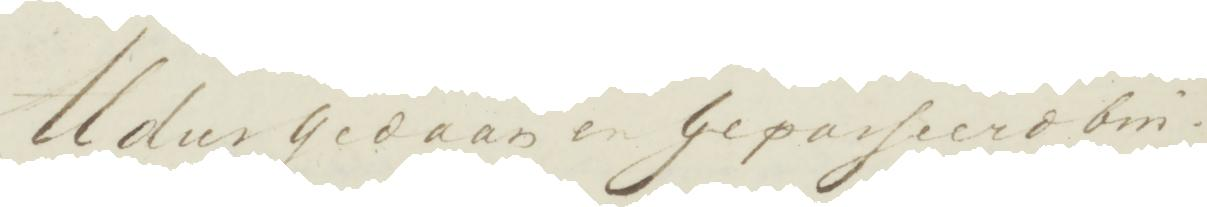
Aldus gedaan en Gepasseerd bin„
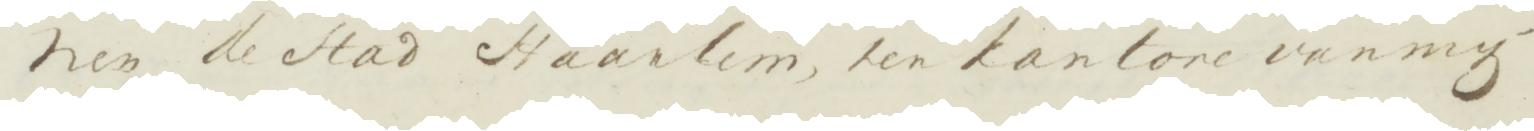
nen de stad Haarlem, ten kantore van mij
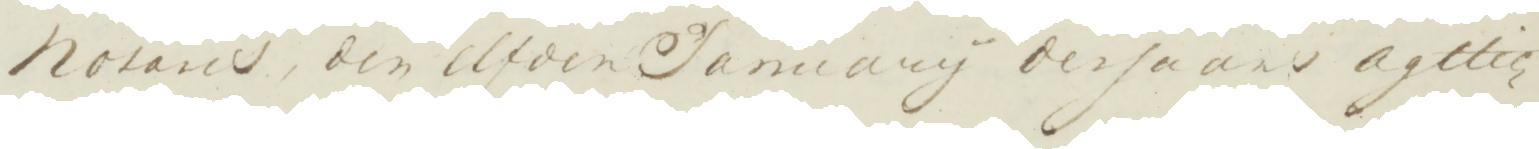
Notaris, den elfden Ianuarij des jaars agttien
